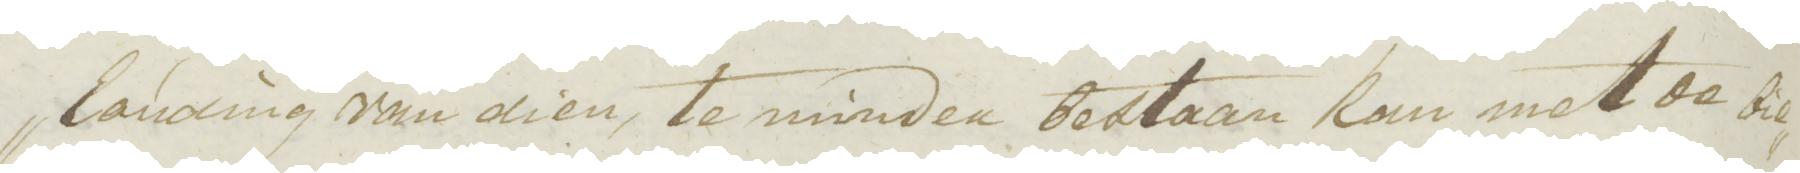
„londing van dien, te minder bestaan kon met de sij
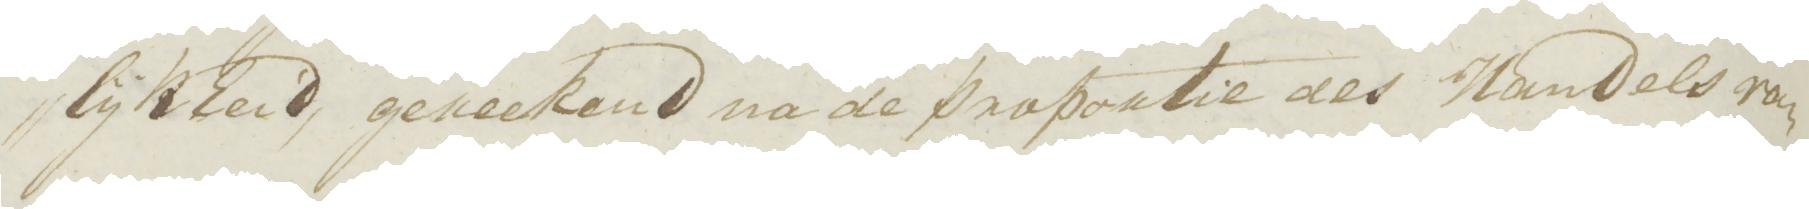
lijkheid, gereekend na de verroportie des handels van
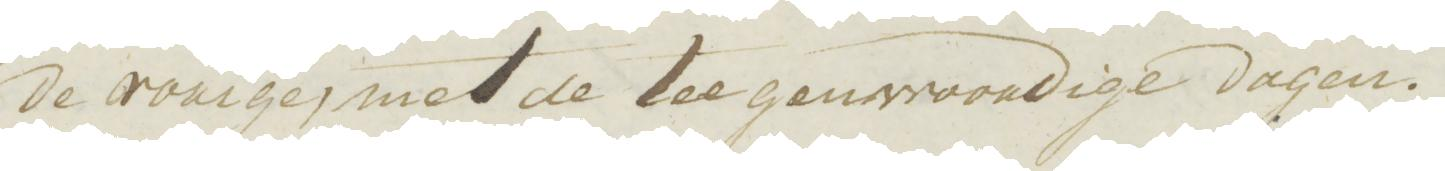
de vorige met de teegenwoordige dagen.
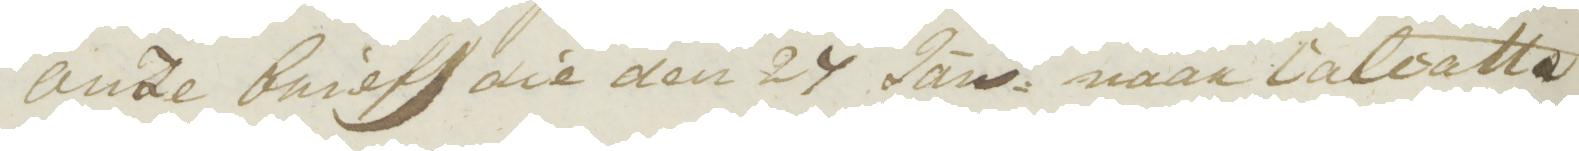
ande brieff die den 27 Jan:i naar dalvatta
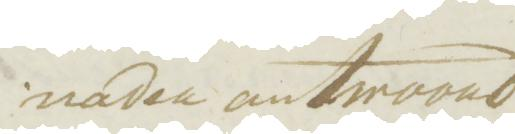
nader antwoond
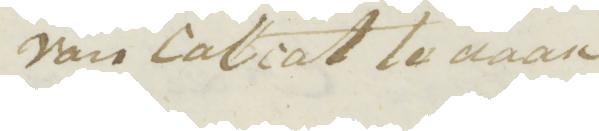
van Catcat te daar
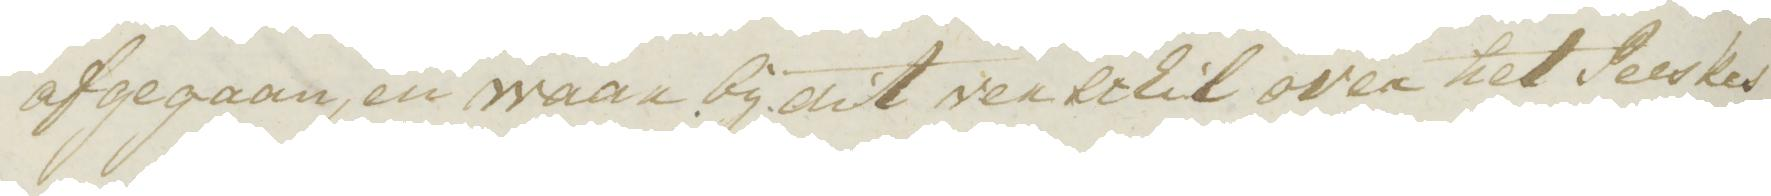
afgegaan en waar bij dut verschil over het seesker
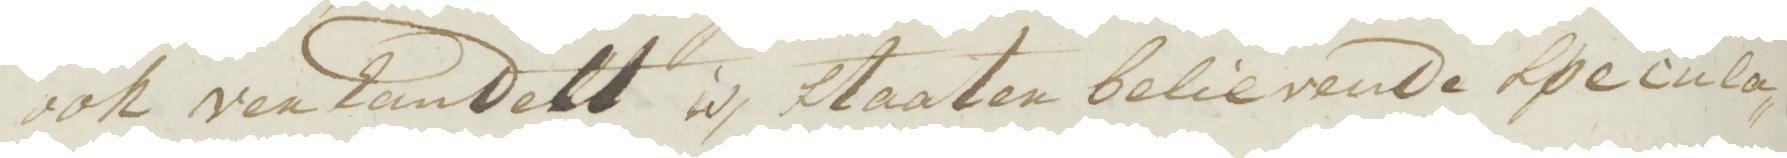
ook verhandelt w, staater believende spe cula„
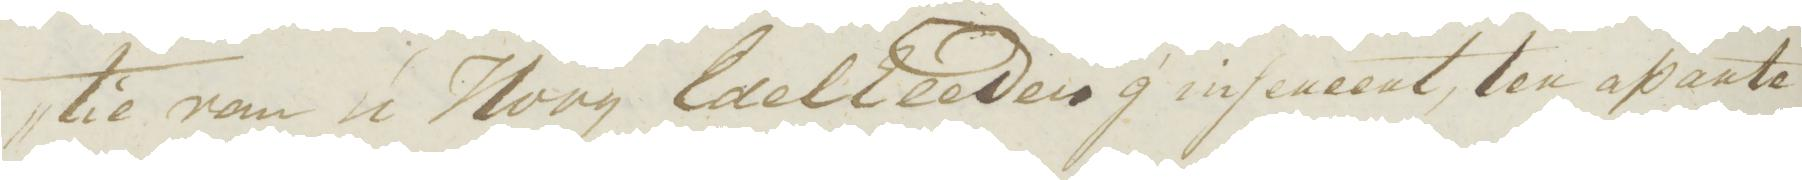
tie van u Norg haelheedes g’infeneert, ter aparte
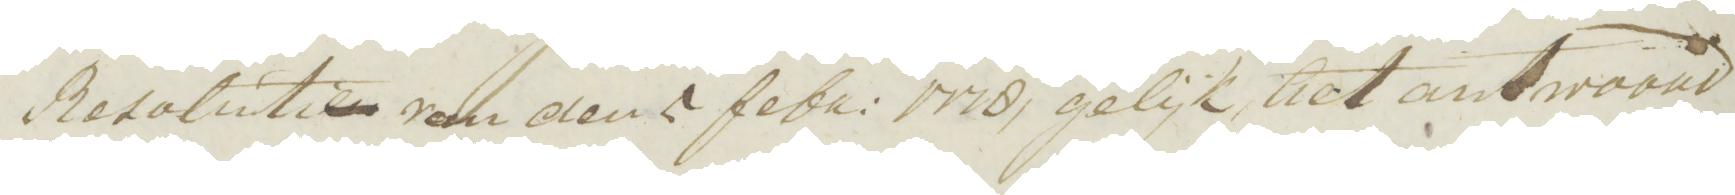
resolutie van denE Febr: 1770, gelijk liet antwoord
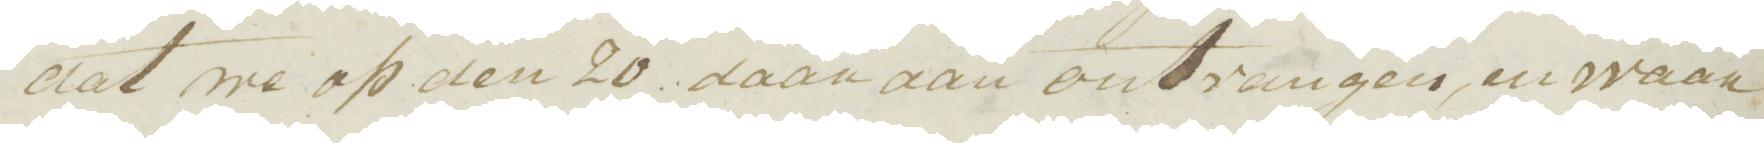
diat we op den 20. daar aan ontvangen, en waar
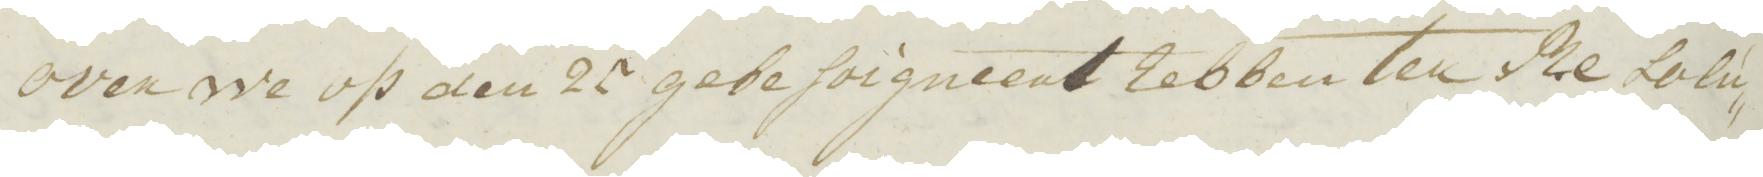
over we op den 25 gebesoigneert hebben ten Nie solu„
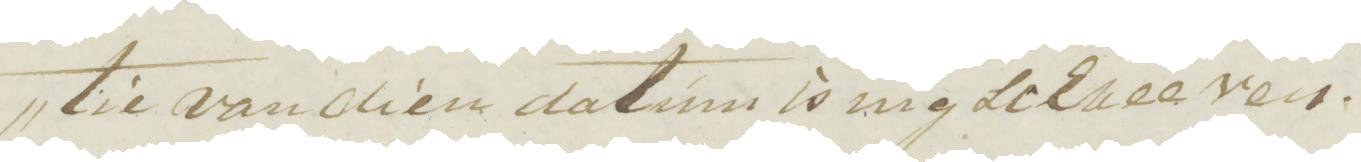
tie van dtien datm id ingschtee ven
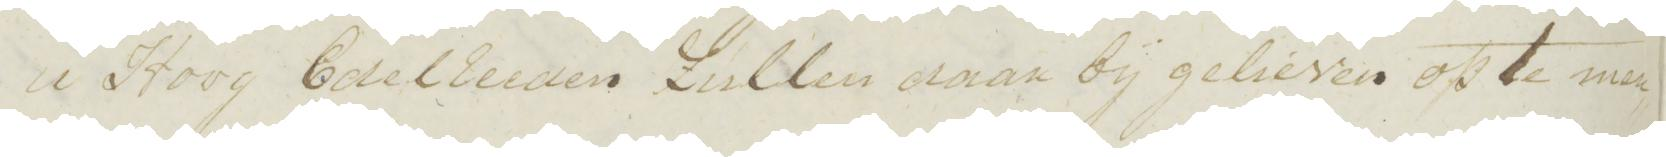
e Hoog bdelheeden zullen daar bij gelieven op te mer=
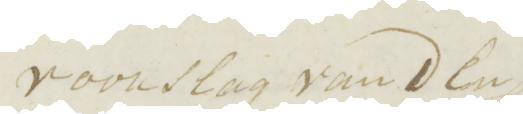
voorslag van d’ En
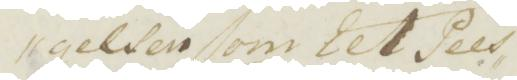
gelsen om het sees
